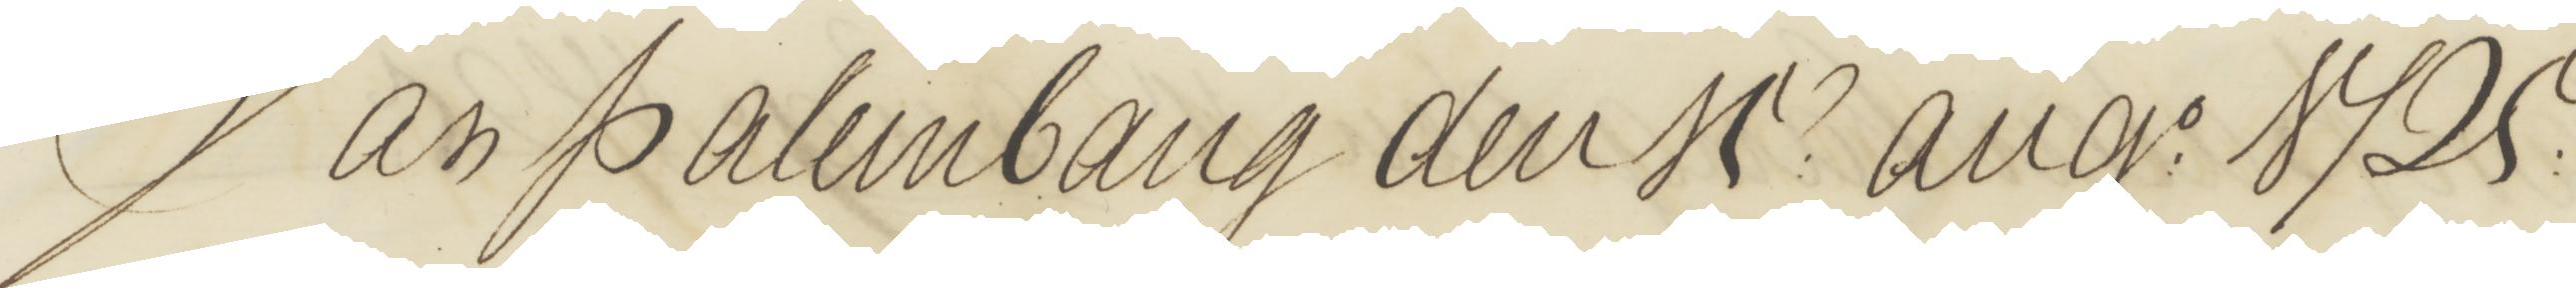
Van Palembang den 15:' aug:o 1725:
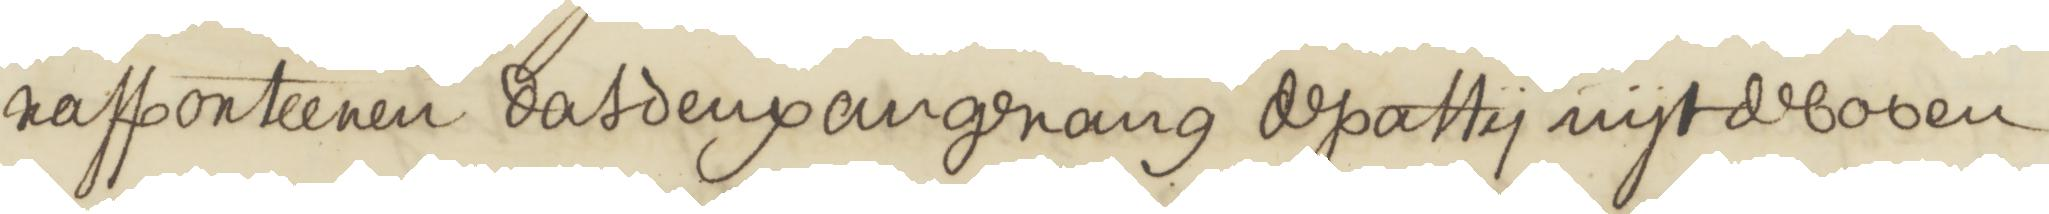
rapporteeren dat den pangerang depattij uijt de boven
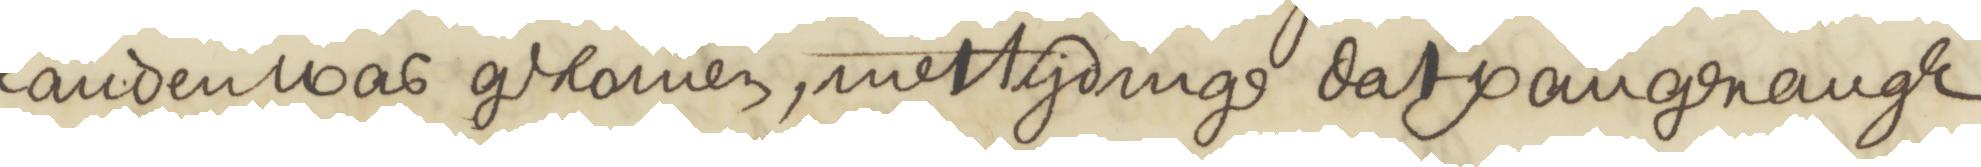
landen was gekomen, mettijdinge dat pangerangh
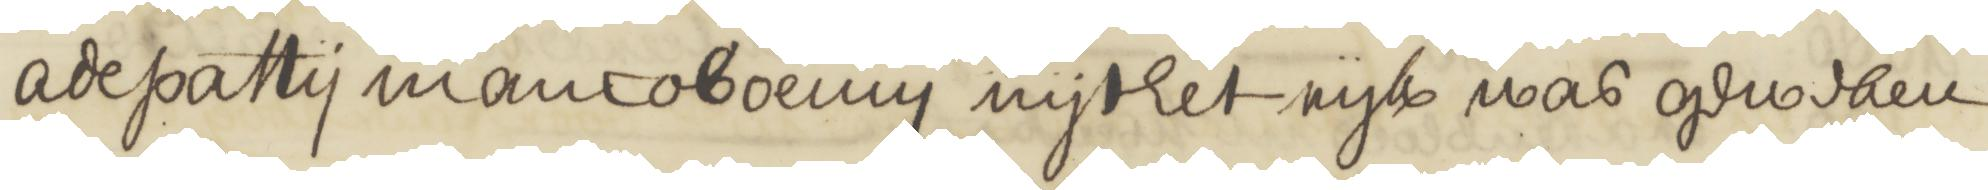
adepattij mancoboemij uijthet rijk was geweken
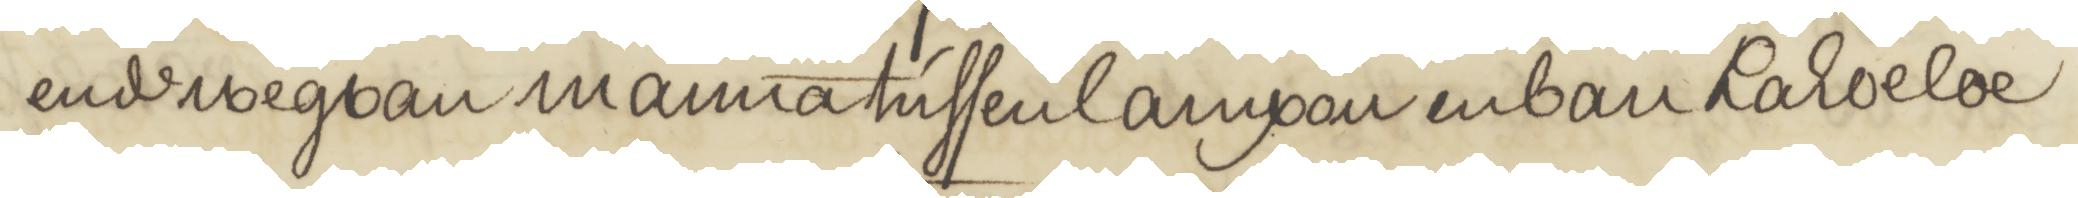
ende wegvan manna tussenlampan en ban kahoeloe
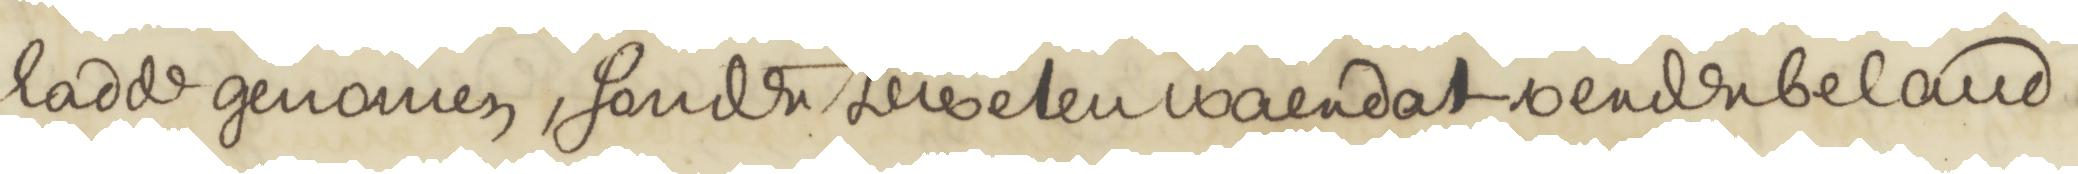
hadde genomen, sonder teweten waerdat verderbeland
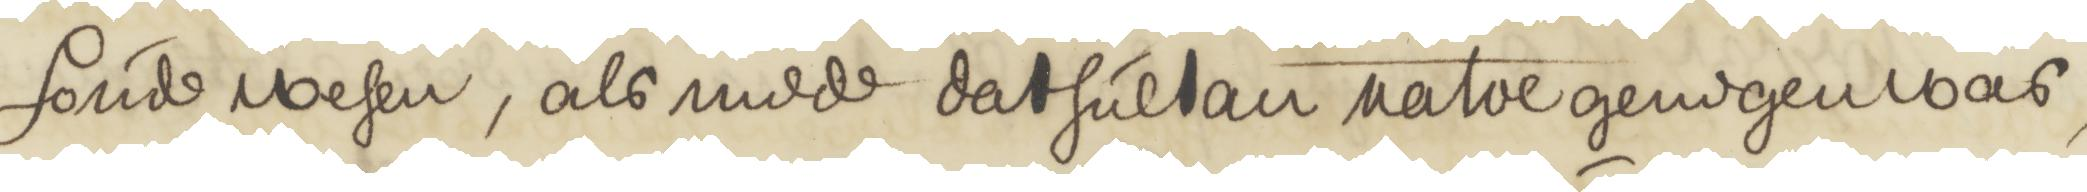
soude wesen, als mede datsultan ratoe genegenwas
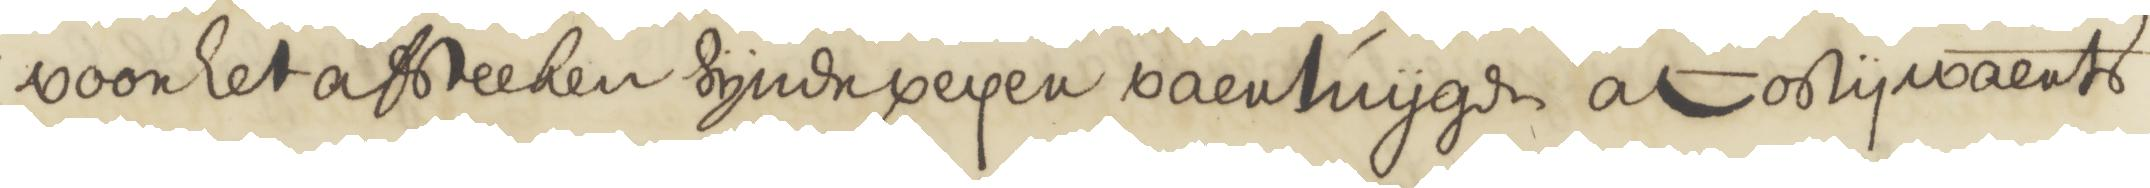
voorhet afsteeken sijnerpeper vaertuijgen â costijwaerts
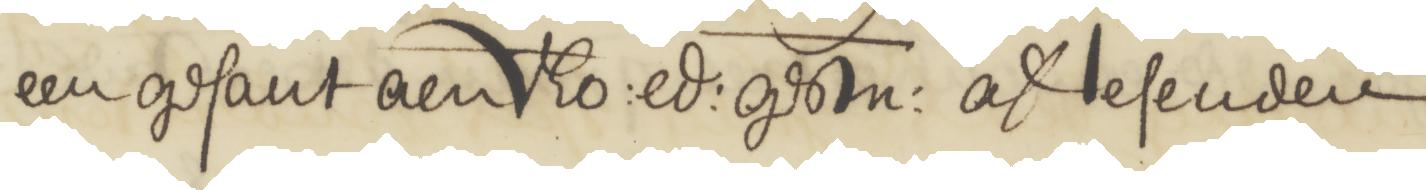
een gesant aen Vho: ed: gestr: af tesenden
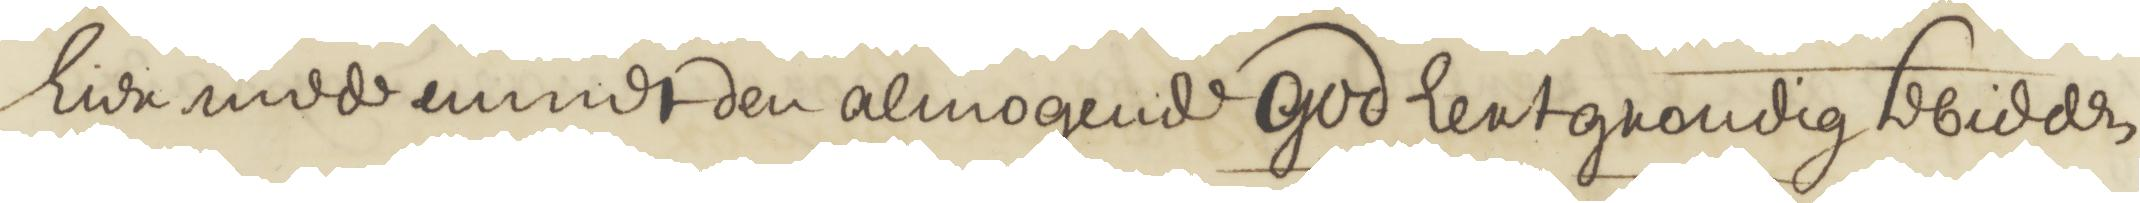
hier mede enmet den almogende God hertgrondig tebidden
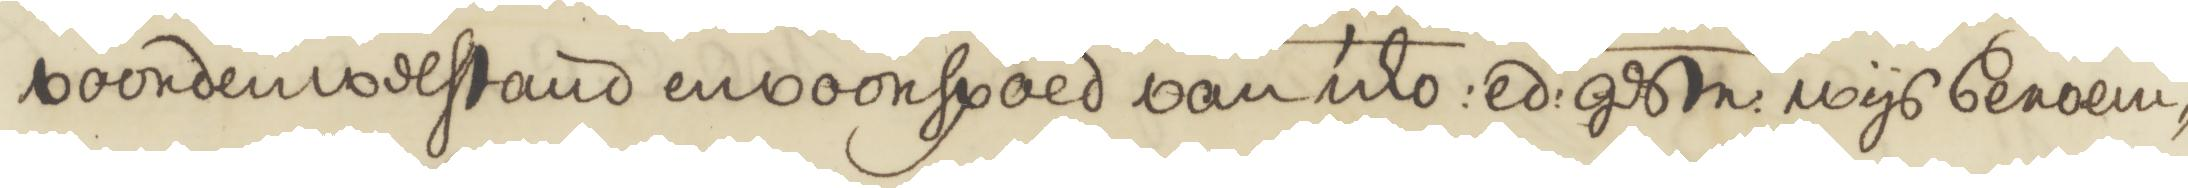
voorden welstand envoorspoed van uho: ed: gestr: wijs beroem„
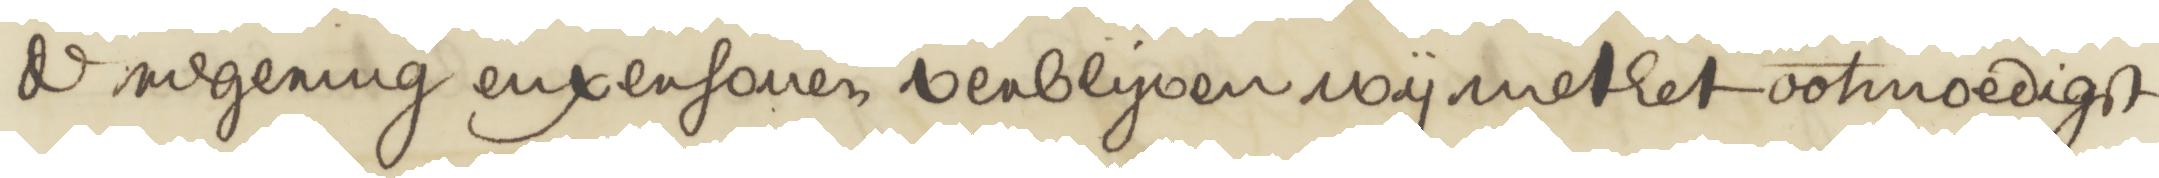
de regering enpersonen verblijven wij methet ootmoedigst
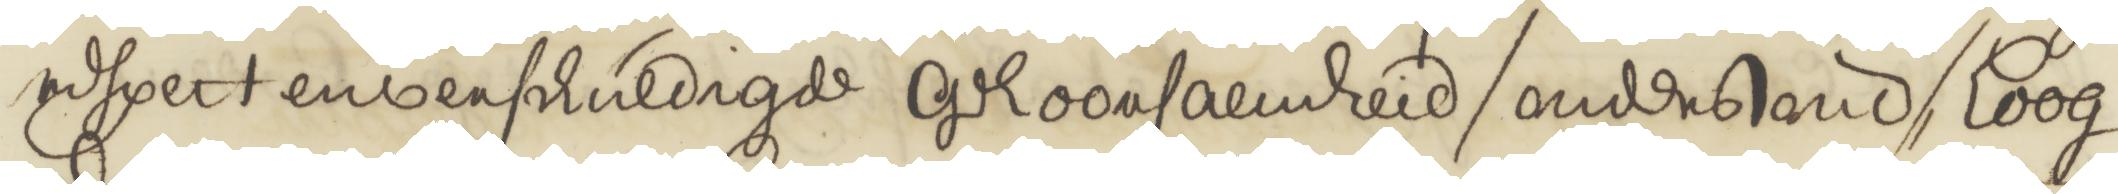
respect enverschuldigde Gehoorsaemheid /onderstond/, hoog
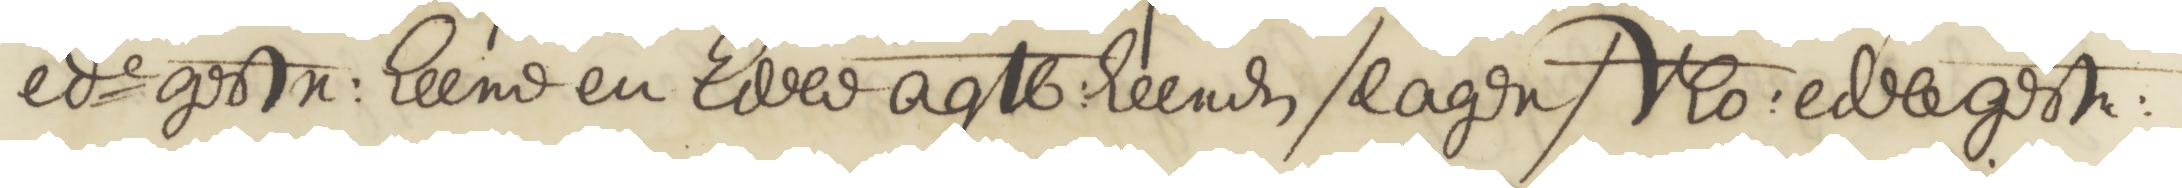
Ed=e gestr: heere en Edele agtb: heeren /lager/ Vho: edelegestr:
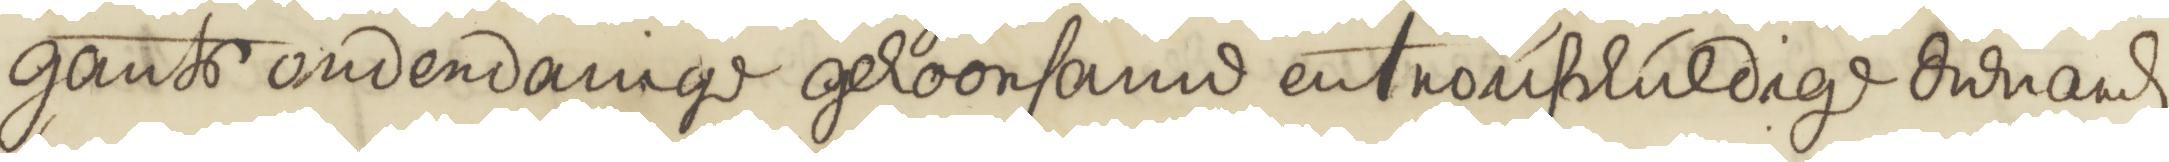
gants onderdanige gehoorsame entrouschuldige dienaren
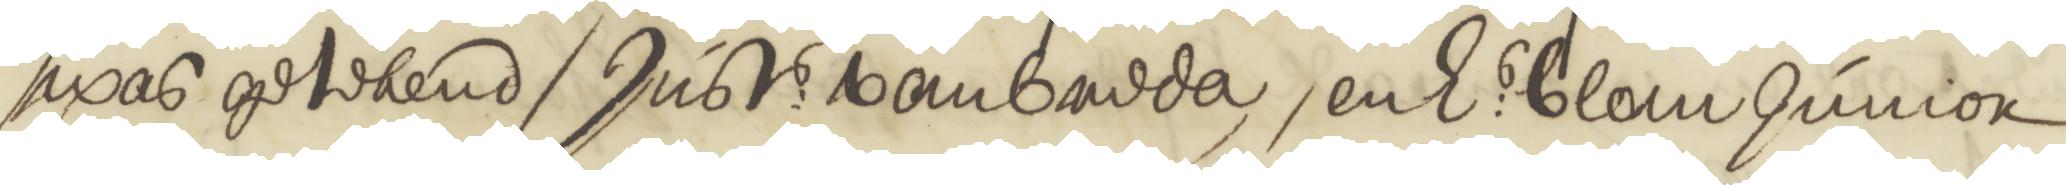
/was getekend/ Just:s van breda, / en h:s blom Junior
